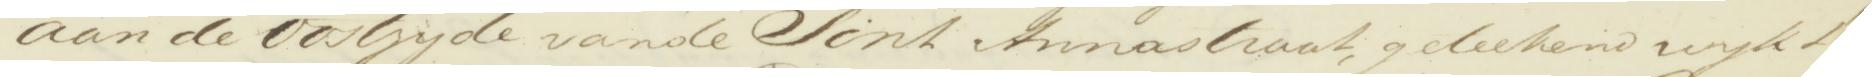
aan de Oostzijde vande Sint Annastraat, geteekend wyk 4
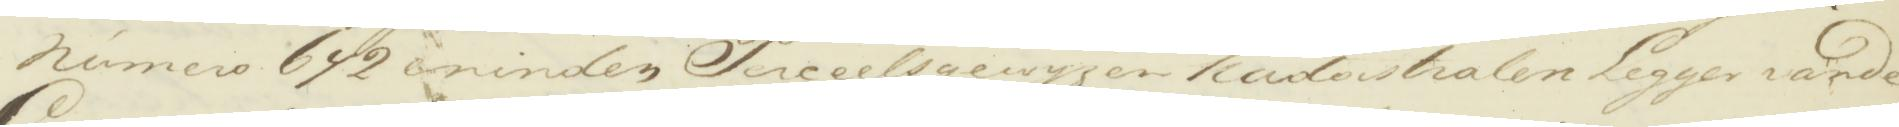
Numero 642 eninden Perceelsgewyzen kadastralen Legger vande
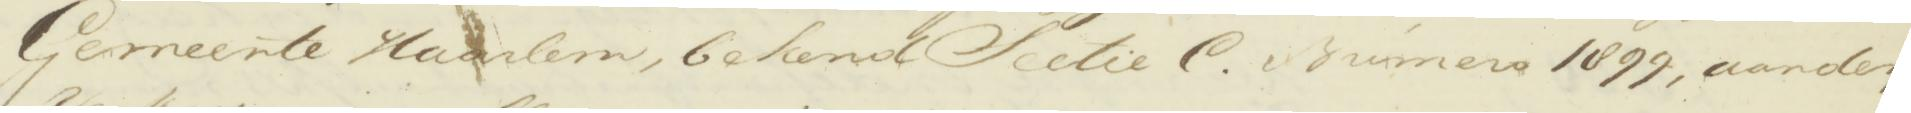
Gemeente Haarlem, bekend Sectie C. Numero 1899, aanden
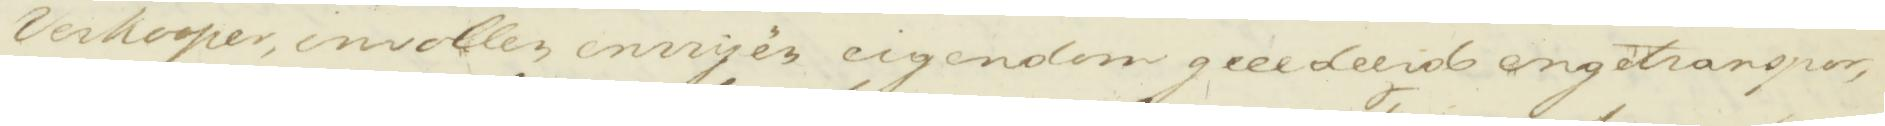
verkooper, invollen en vrijen eigendom gecedeerd engetranspor,
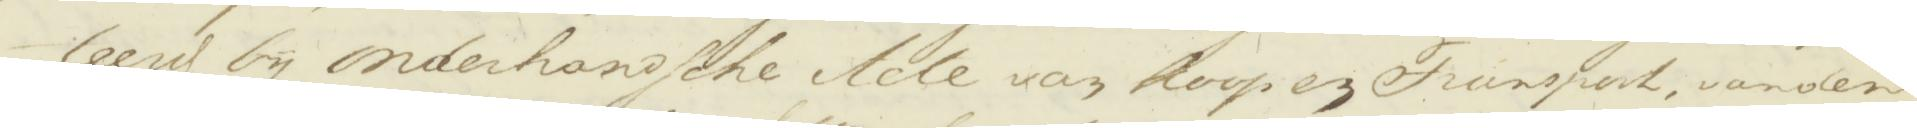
, teerd bij onderhandsche Acte van koop en Transport, van den
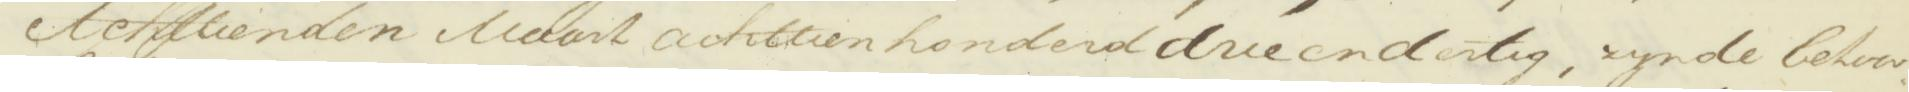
Achttienden Maart achttienhonderd drie en dertig, zynde behoor„
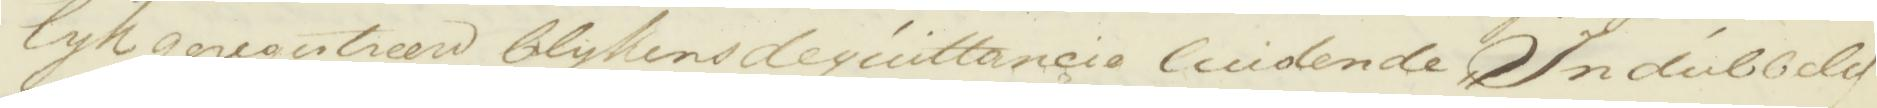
lyk geregistreerd, blijkens de quittancie luidende ,,In dubbeld
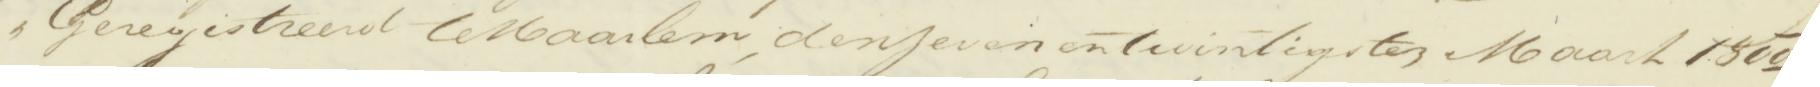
„ Geregistreerd teHaarlem denzeven en twintigsten Maart 1800
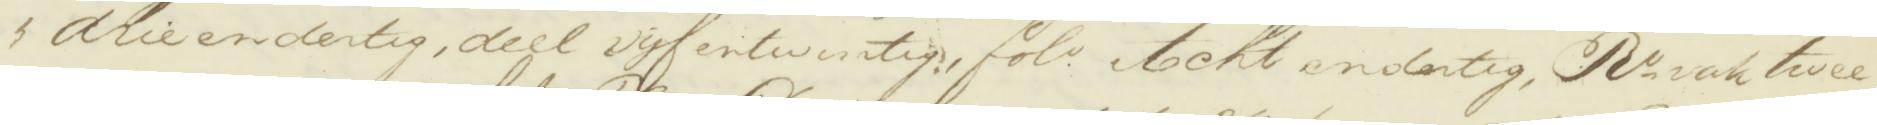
„drie en dertig, deel vjf entwintig, fol.o Acht endertig, R=o vak twee,
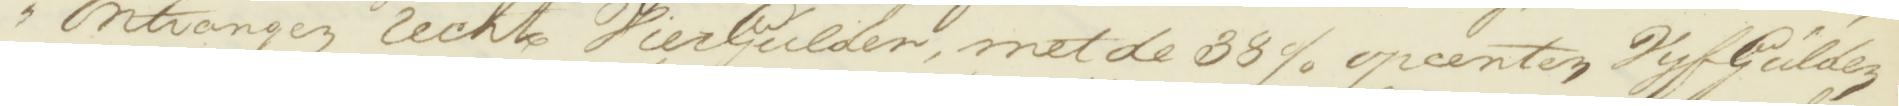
„ontvangen recht VierGulden, met de 38% op centen Vyf Gulden
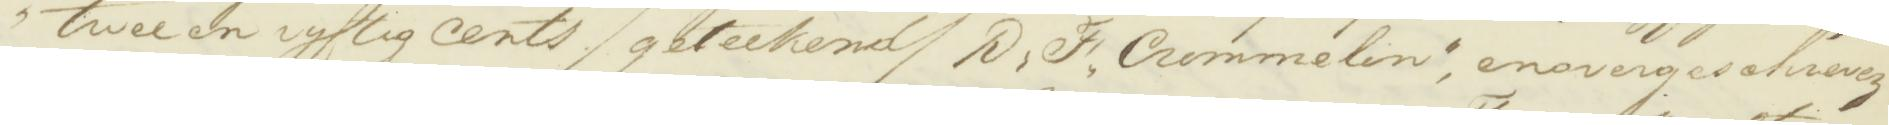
„twee en vyftig cents /geteekend/ D„F„ Crommelin", en overgeschreven
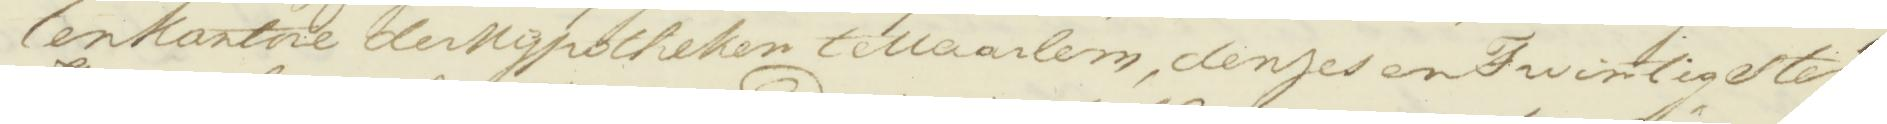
ten kantore derHijpotheken te Haarlem, denzes enTwintigsten
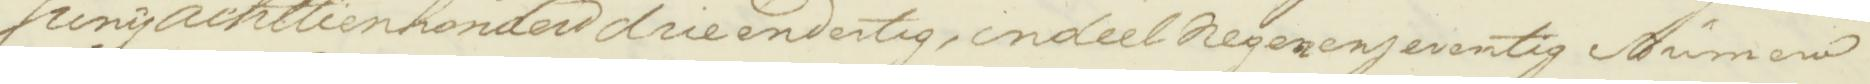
Junij achttienhonderd drie endertig, indeel Negenenzeventig Numero
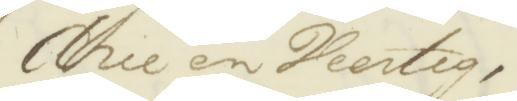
Drie en Veertig,
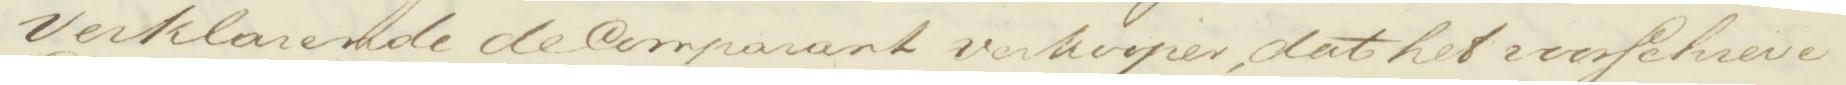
verklarende de comparant verkooper, dat het voorschreve
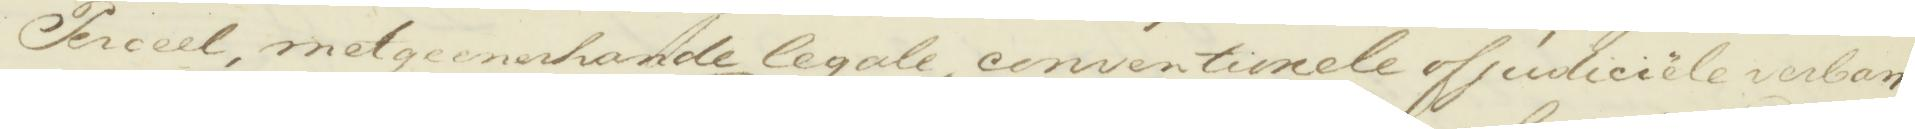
Perceel, met geenerhande legale, conventionele of juidiciële verban
